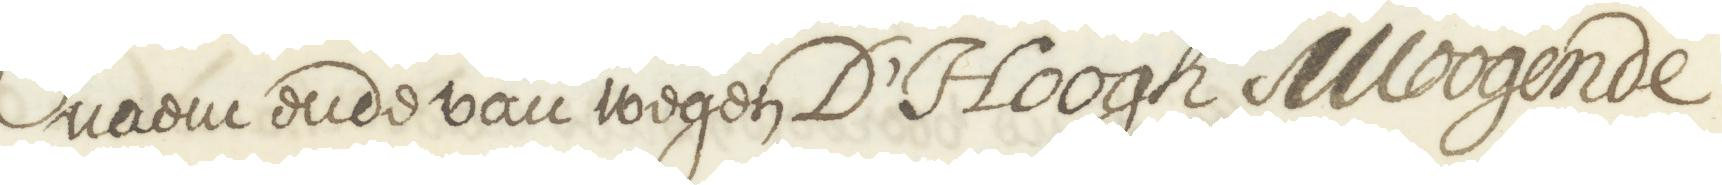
naem ende van wegen D’Hoogh Moogende
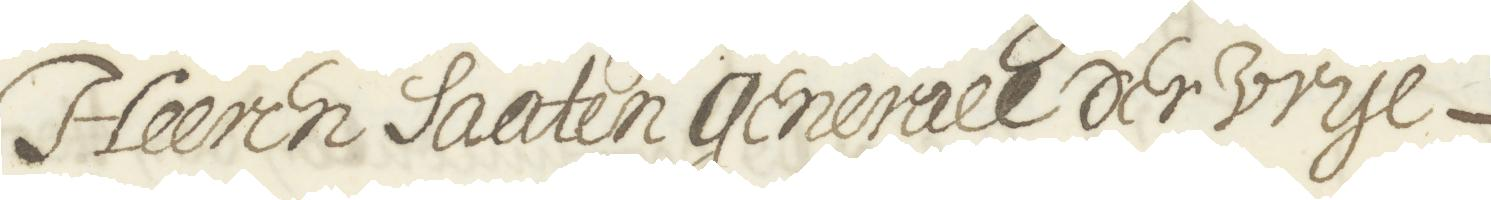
Heeren Saaten generael der Vrije —
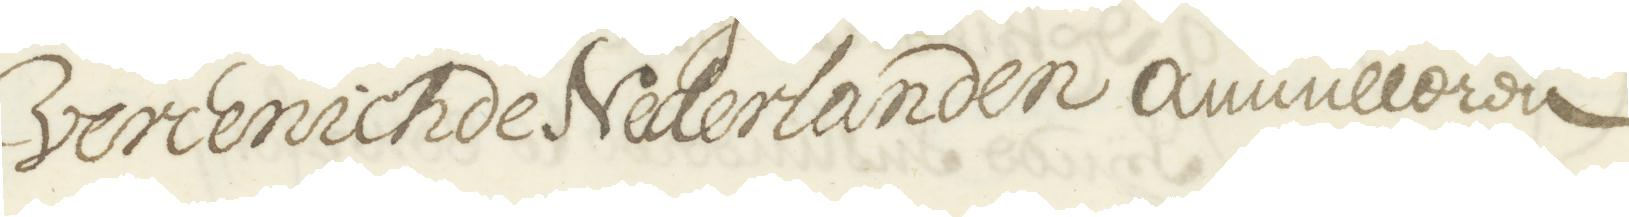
Vereenichde Nederlanden annulleren
